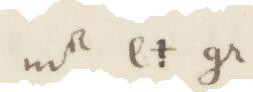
mk l.t gr
